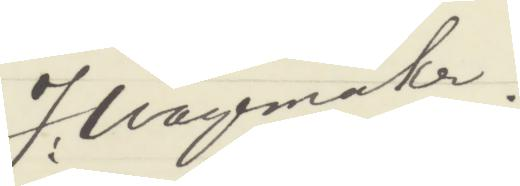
J:Wagemaker.
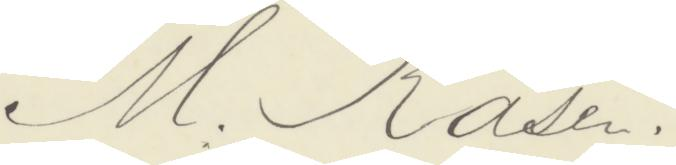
M: Rasen.
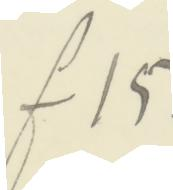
ƒ 15
